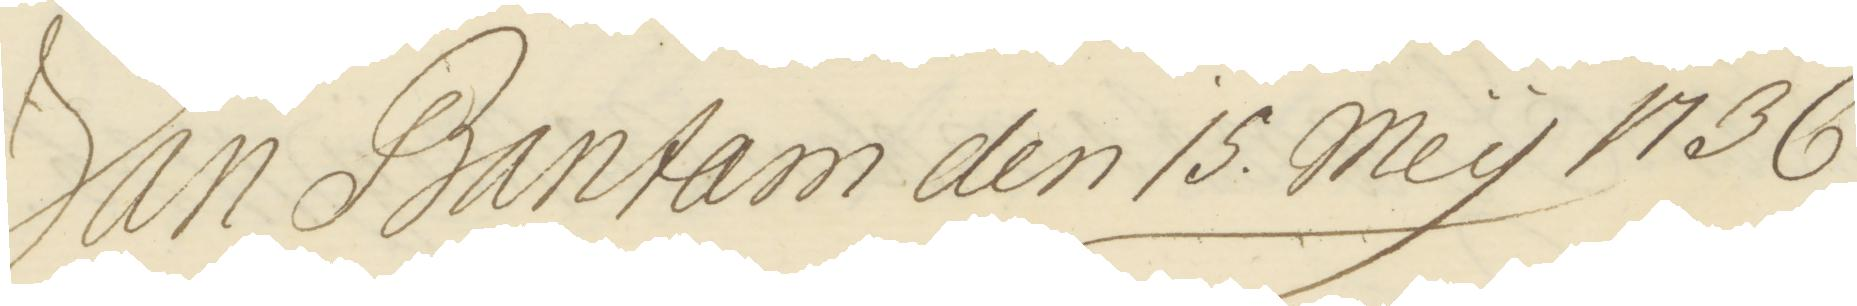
Van Bantam den 15. Meij 1736
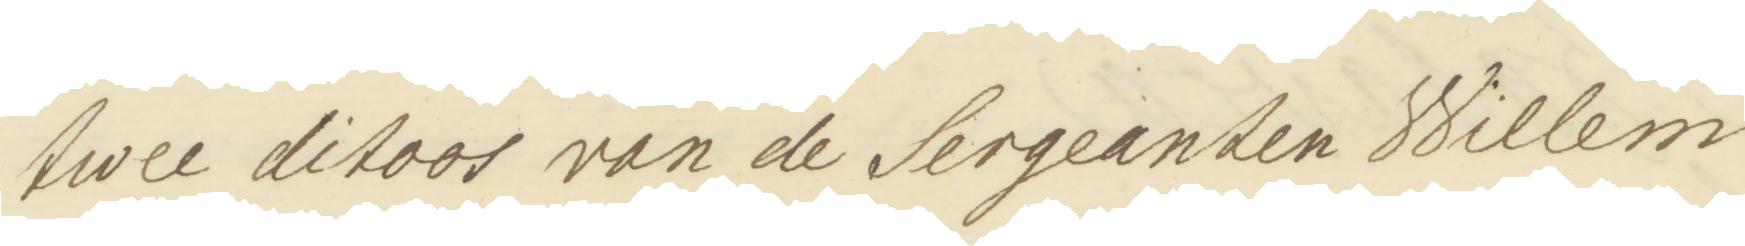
twee ditoos van de Sergeanten Willem
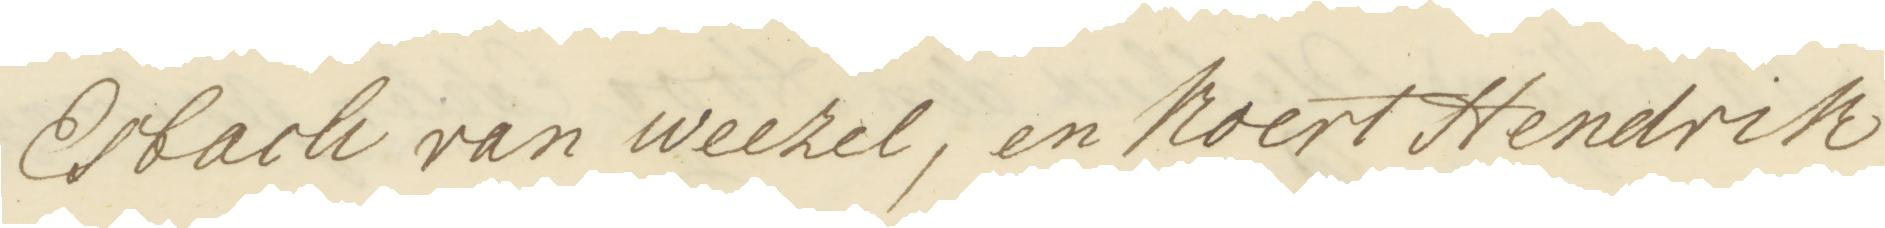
Esbach van weezel, en Koert Hendrik
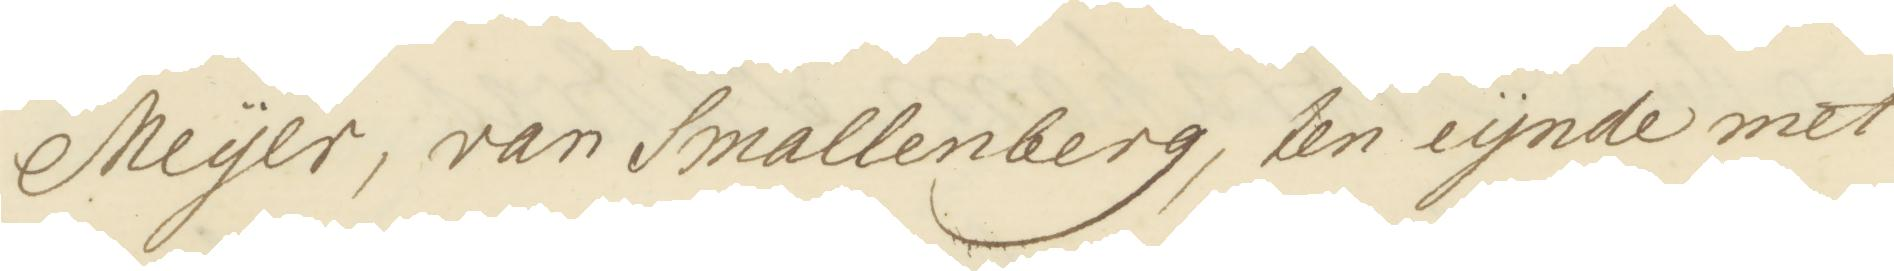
Meijer, van Smallenberg, ten eijnde met
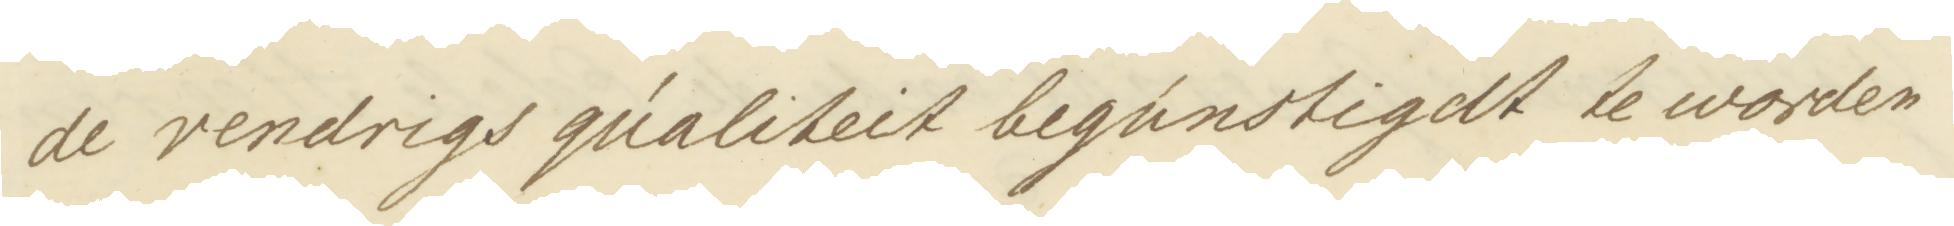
de vendrigs qualiteit begunstigdt te worden
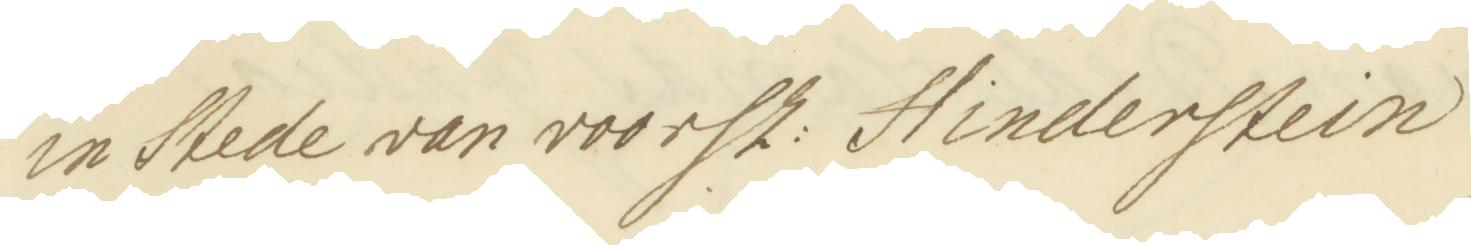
in stede van voorsz: Hinderstein
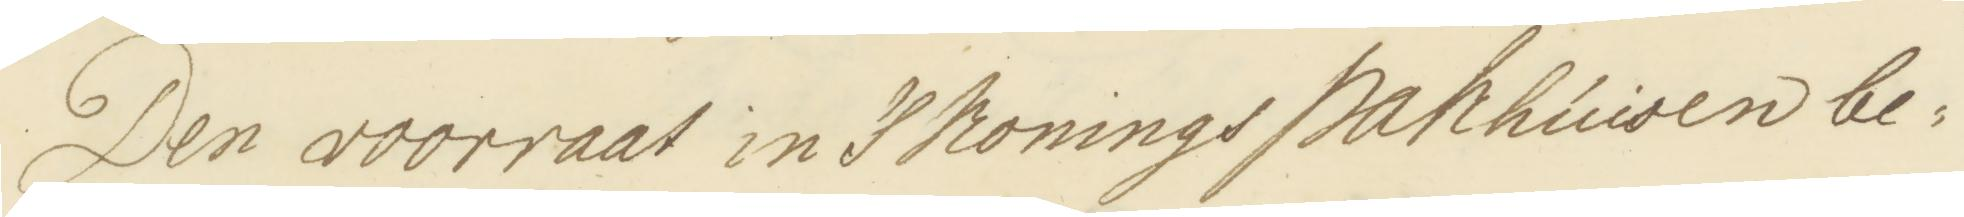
Den voorraat in ’S Konings pakhuisen be„
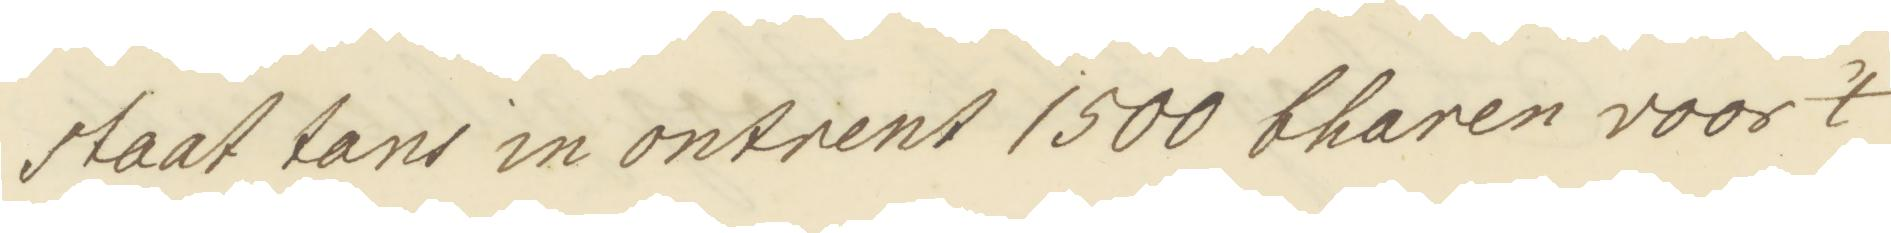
staat tans in ontrent 1500 bharen voor ’t
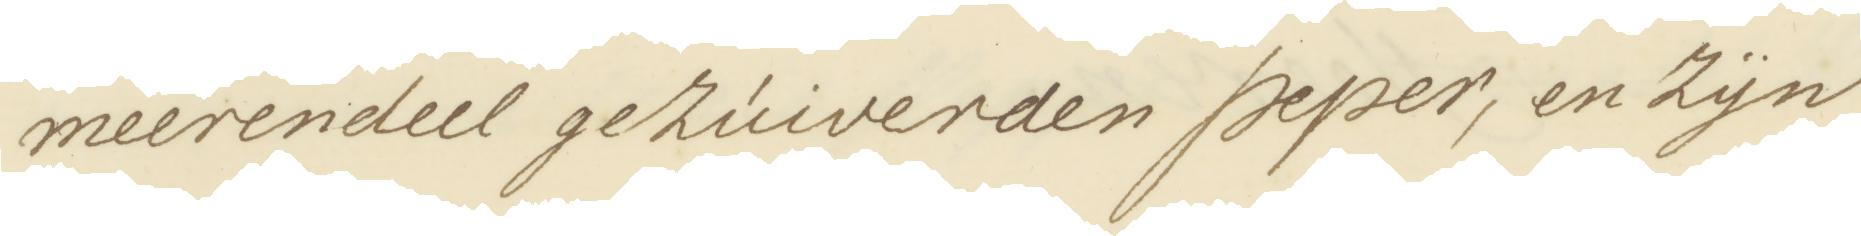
meerendeel gezuiverden peper, en Zijn
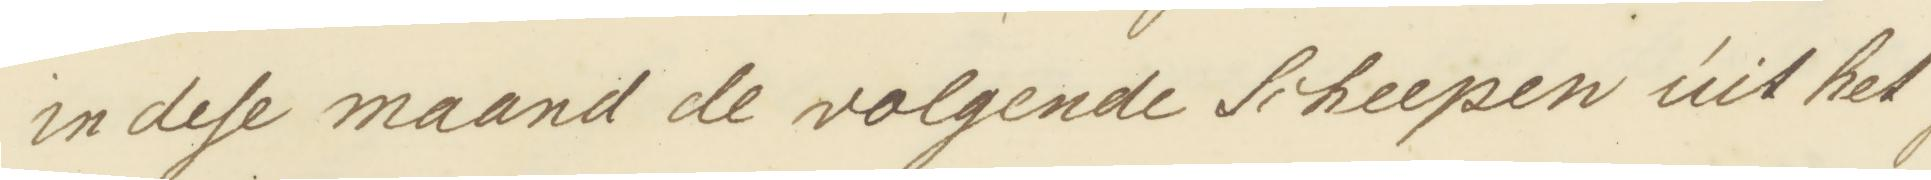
in dese maand de volgende scheepen uit het
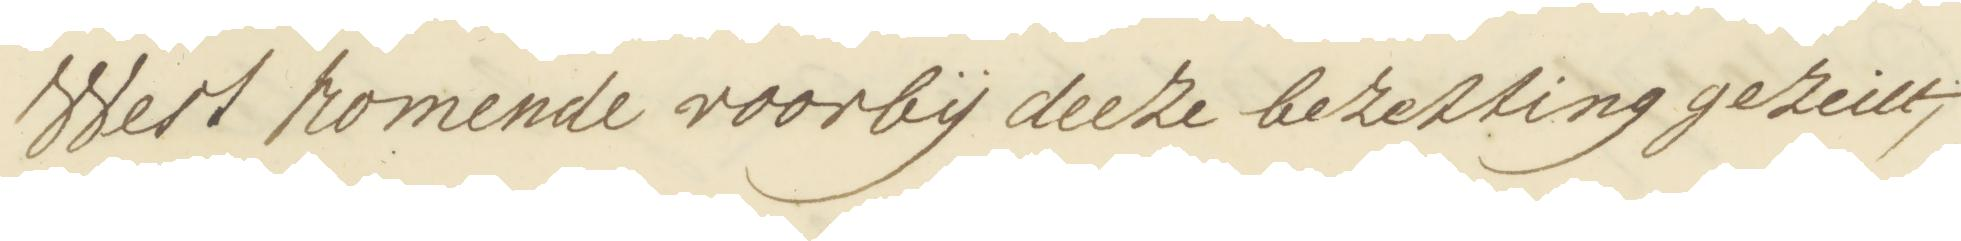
West komende voorbij deeze bezetting gezeilt;
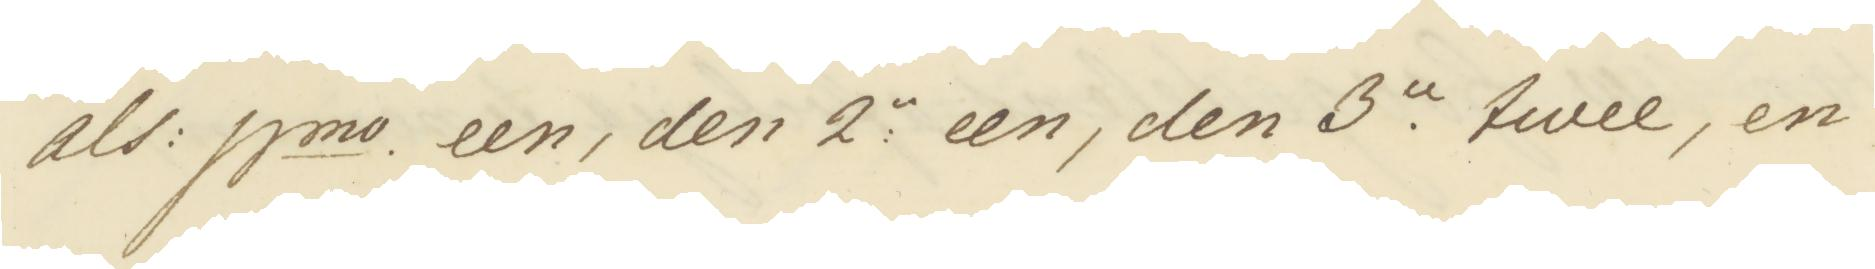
als: p-mo. een, den 2:e een, den 3.e twee, en
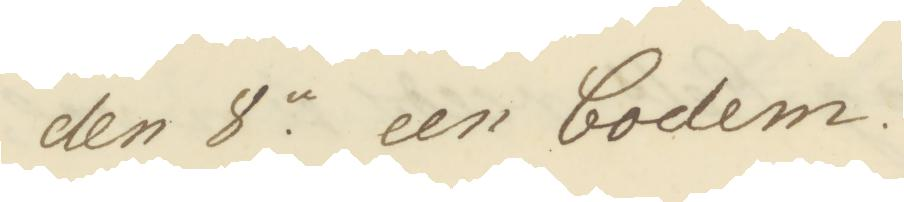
den 8.e een bodem.
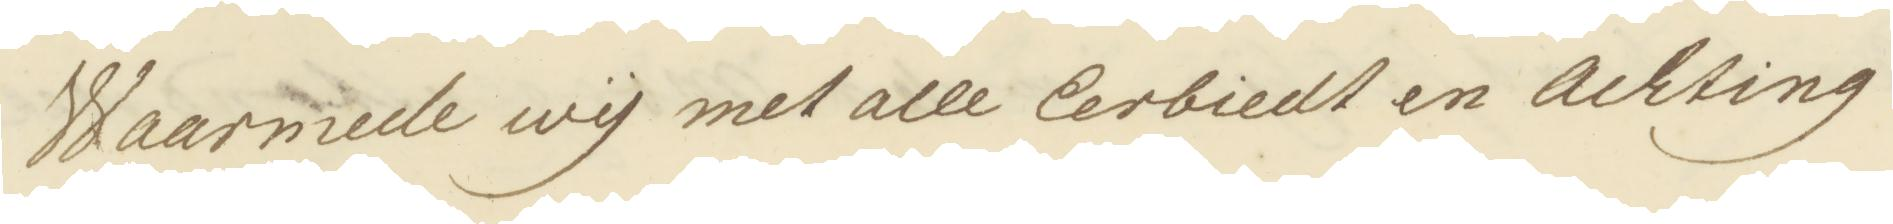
Waarmede wij met alle Eerbiedt en achting
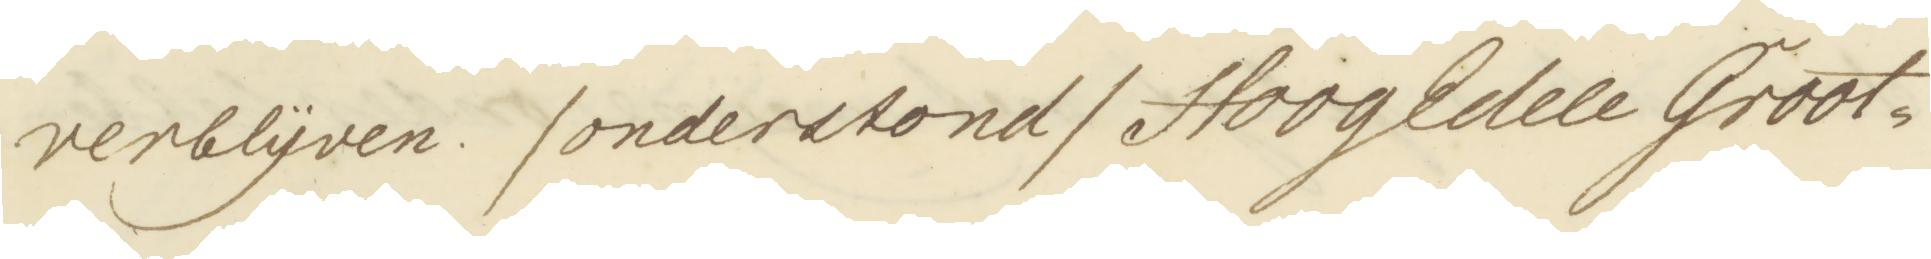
verblijven. /onderstond/ Hoog Edele Groot„
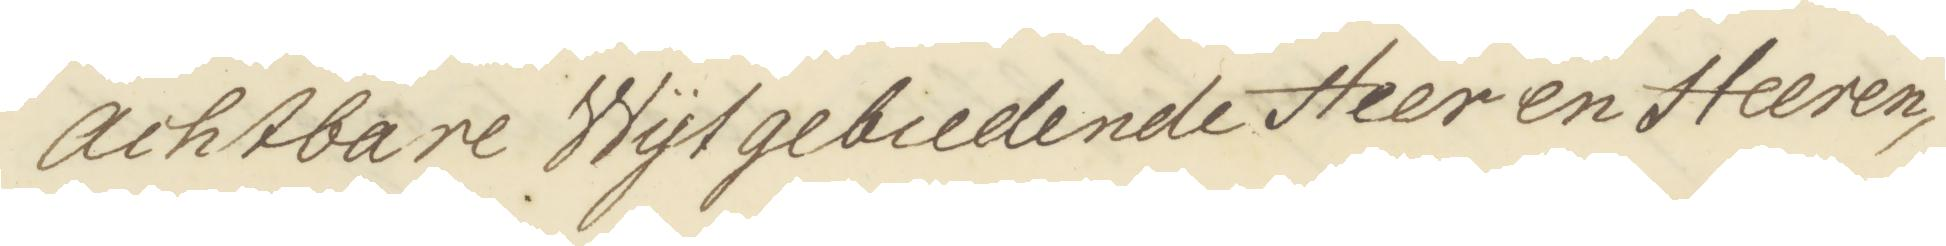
achtbare Wijt gebiedende Heer en Heeren,
